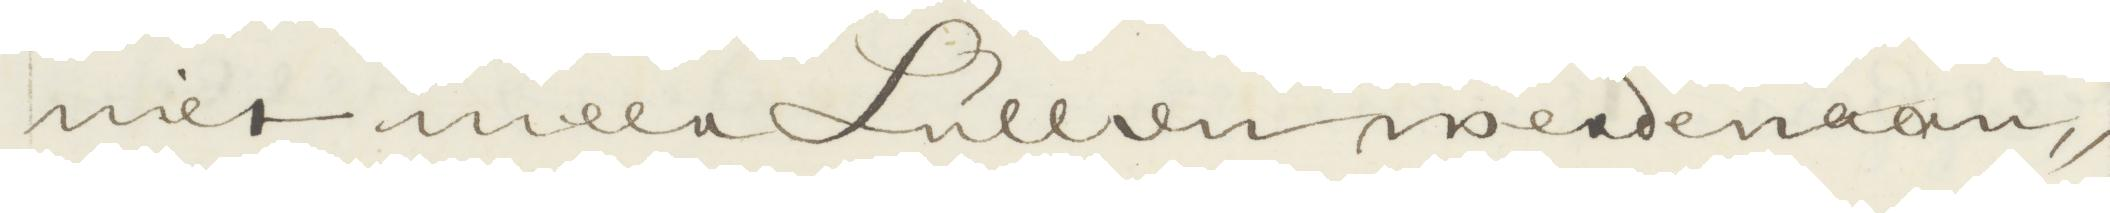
niet meer sullen werden aan„
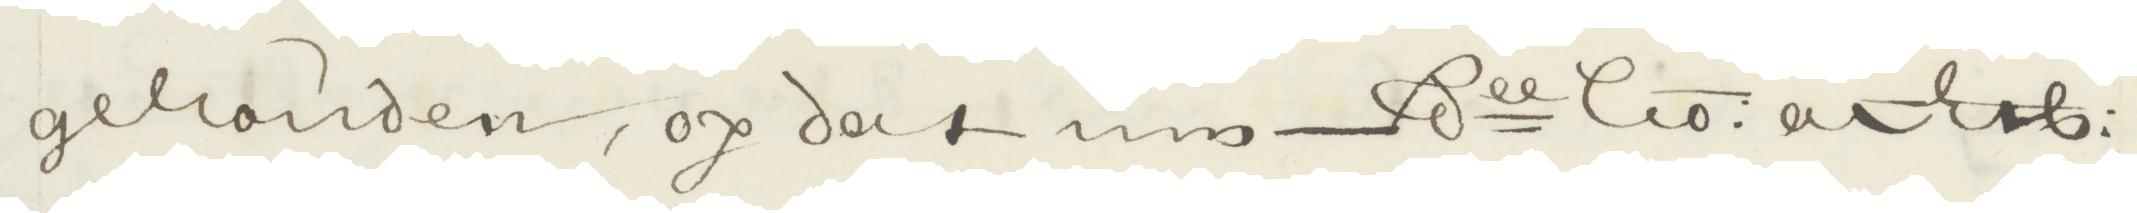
gehouden, op dat uw Ed=le ho: achtb:
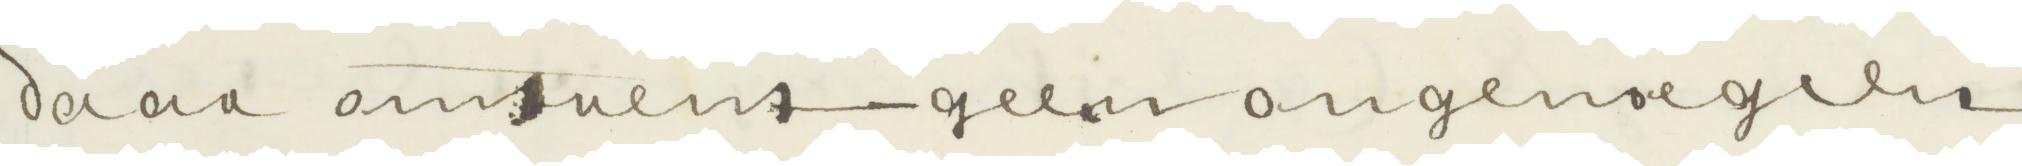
daar omtrent geen ongenoegen
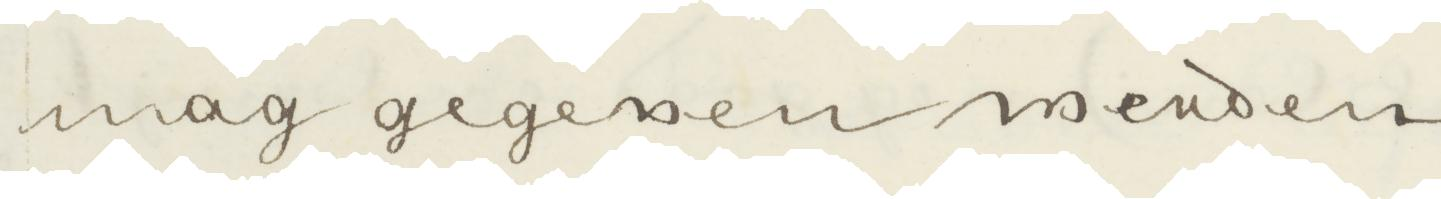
mag gegeven werden
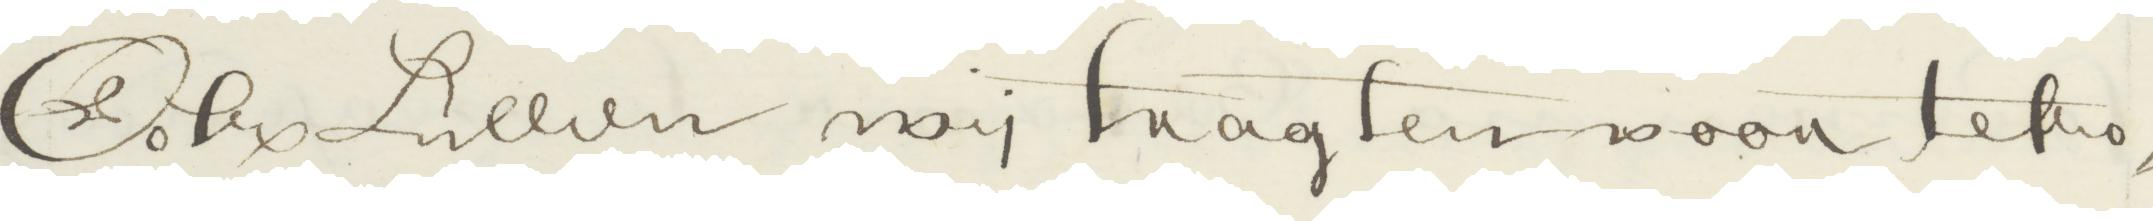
Ook sullen wij tragten voor te ko„
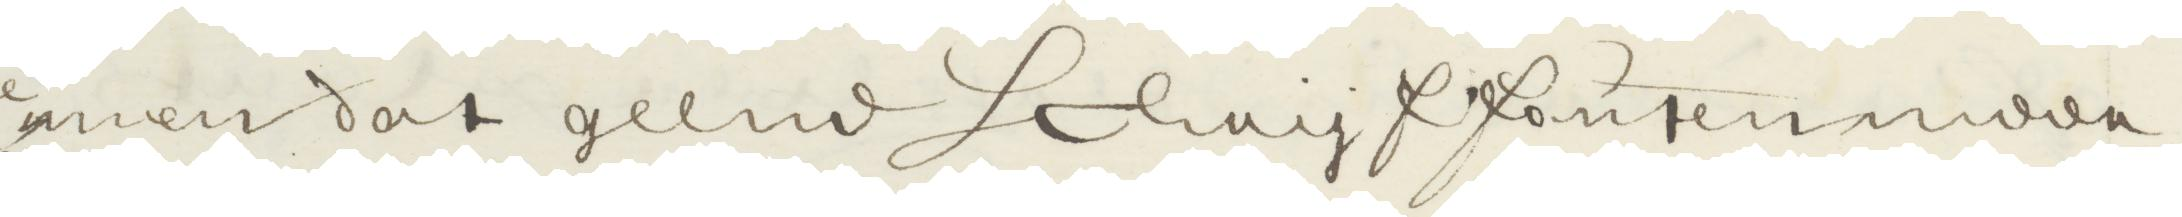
„men dat geene schrijf fouten meer
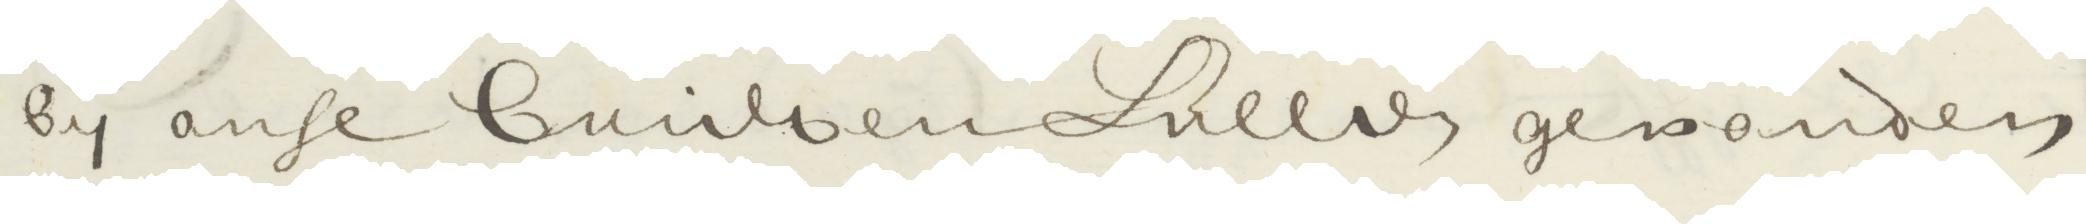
bij onse brieven zullen gevonden
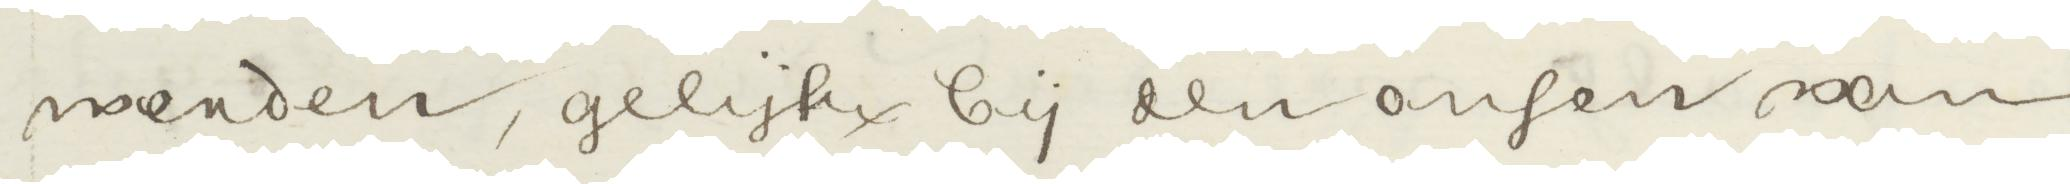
werden, gelijk bij den onsen van
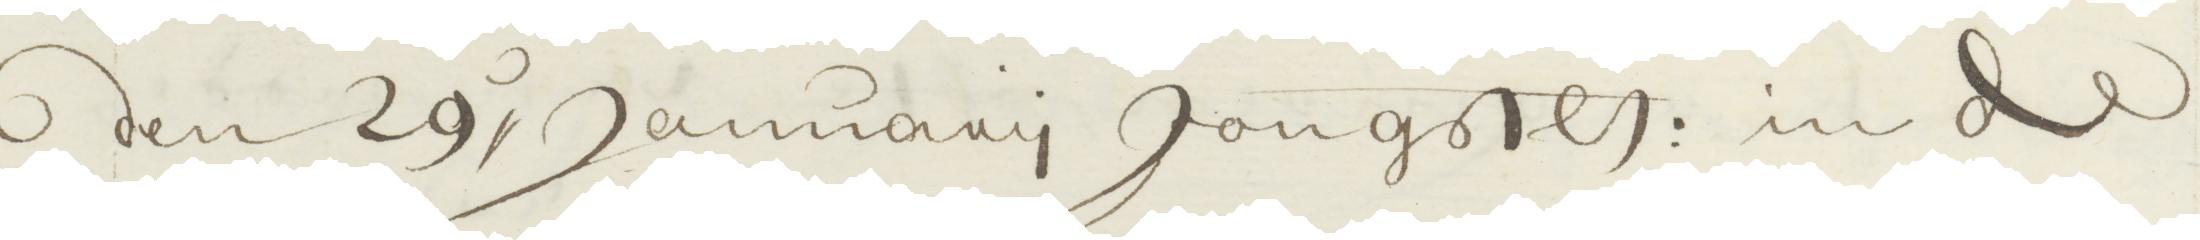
den 29„' Januarij Jongstlijk in de
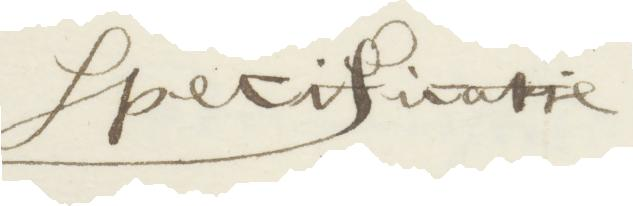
specificatie
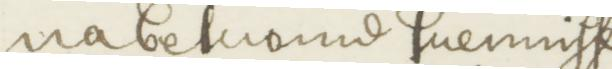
na bekome kennisse
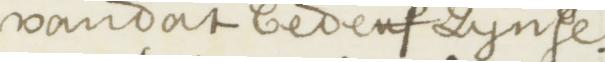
van dat bederf zijnse.
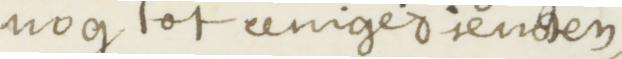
nog tot eenige diensten
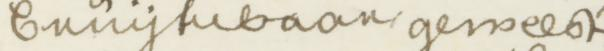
bruijkbaar geweest
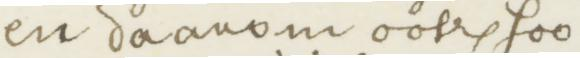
en daarom ook soo
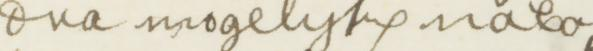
dra mogelijk na ba„
